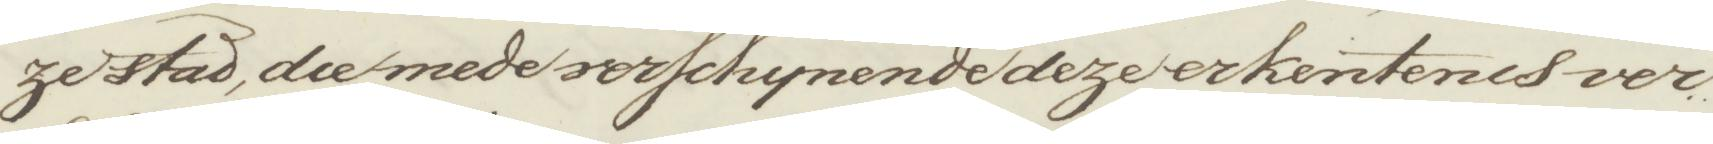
ze stad, die mede verschynende deze erkentenis ver„
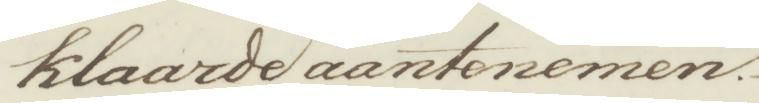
klaarde aantenemen.
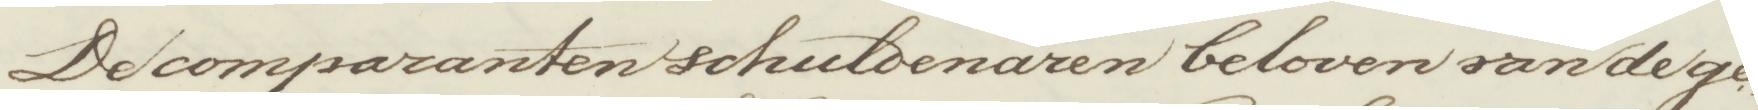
De comparanten schuldenaren beloven van de ge„
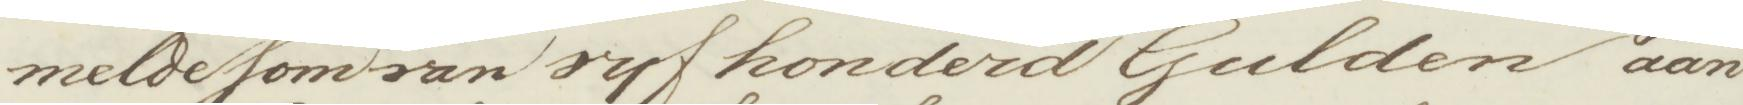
melde som van vyf honderd Gulden aan
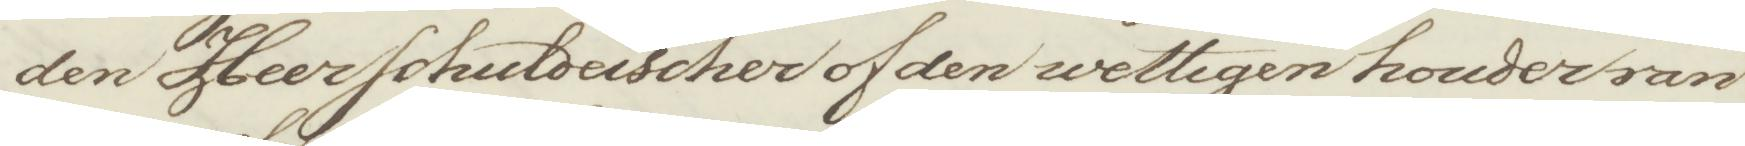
den Heer schuldeischer of den wettigen houder van
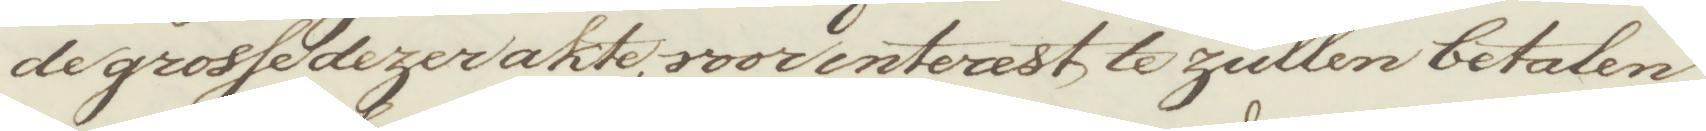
de grosse dezer akte, voor interest te zullen betalen
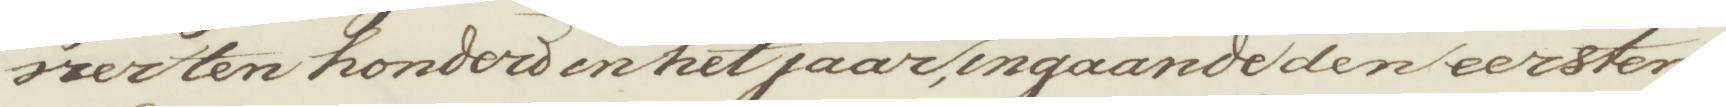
vier ten honderd in het jaar, ingaande den eersten
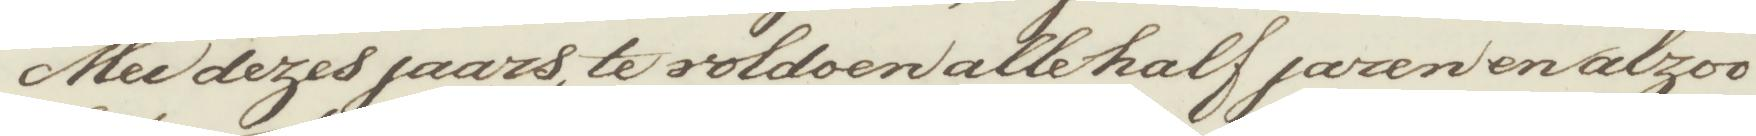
Mei dezes jaars, te voldoen alle half jaren en alzoo
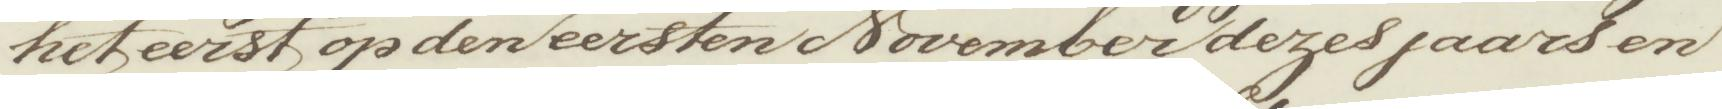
het eerst op den eersten November dezes jaars en
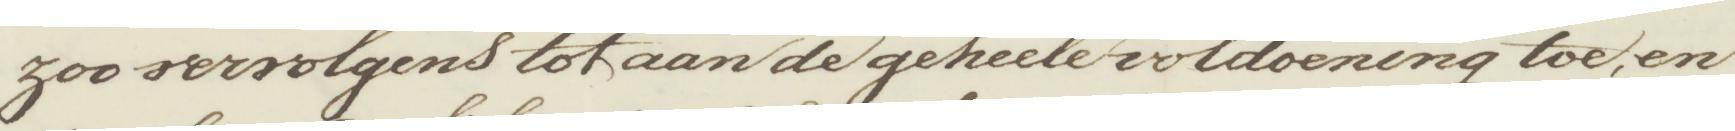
zoo vervolgens tot aan de geheele voldoening toe, en
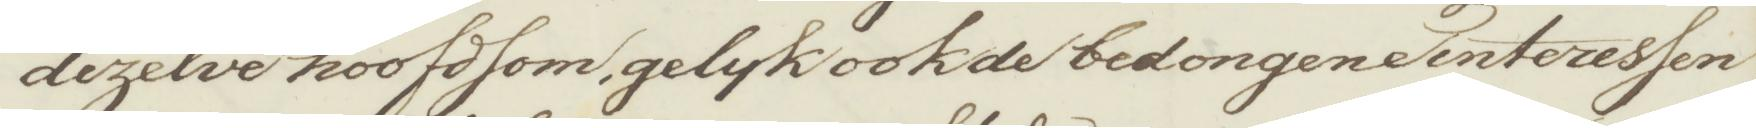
dezelve hoofdsom, gelyk ook de bedongene interessen
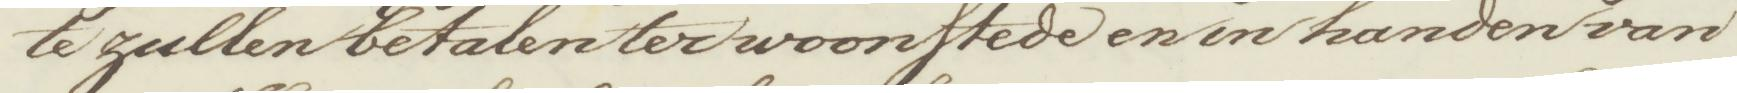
te zullen betalen ter woonstede en in handen van
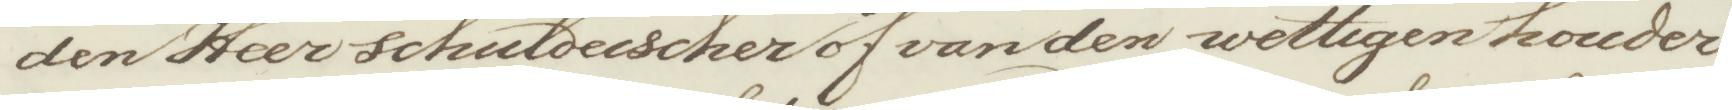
den Heer schuldeischer of van den wettigen houder
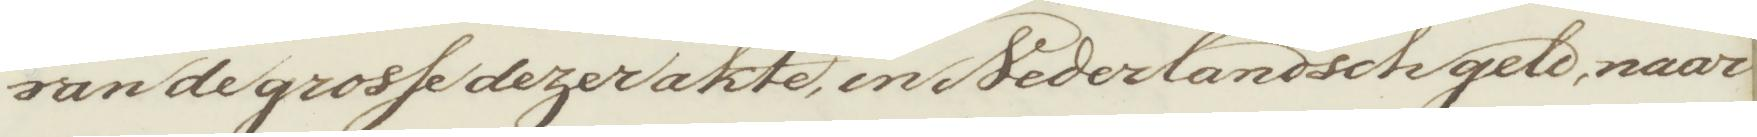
van de grosse dezer akte, in Nederlandsch geld, naar
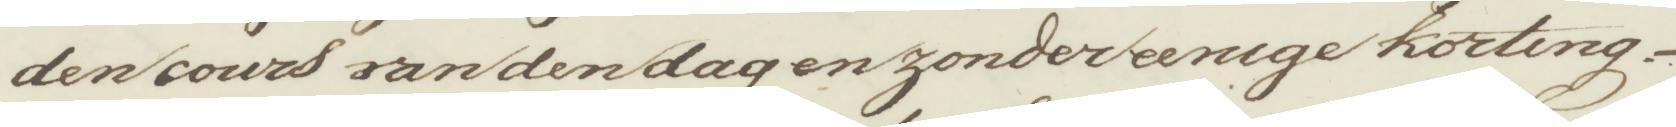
den cours van den dag en zonder eenige korting.-
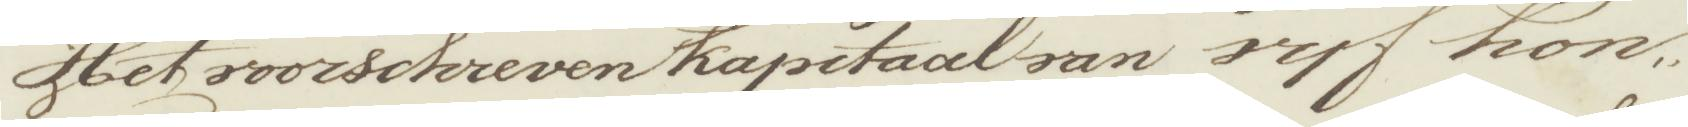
Het voorschreven kapitaal van vyf hon„
